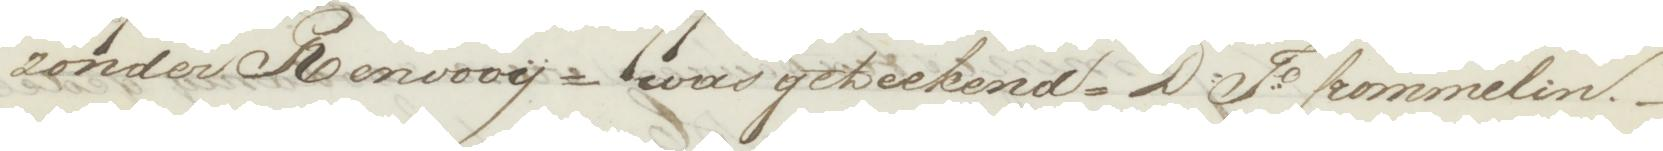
zonder Renvooij = was geteekend = D: F: Crommelin. —
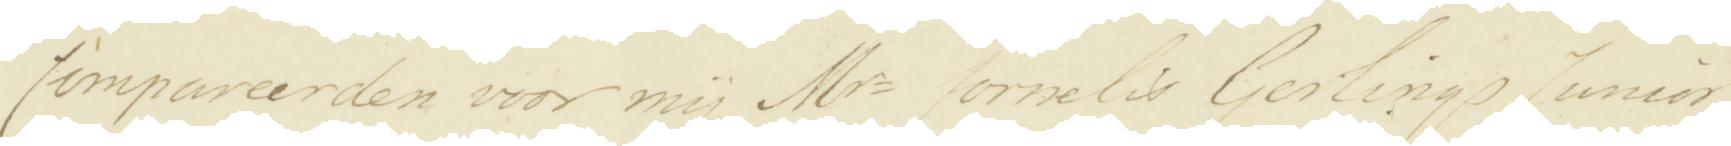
Compareerden voor mij Mr= Cornelis Gerlings Junior
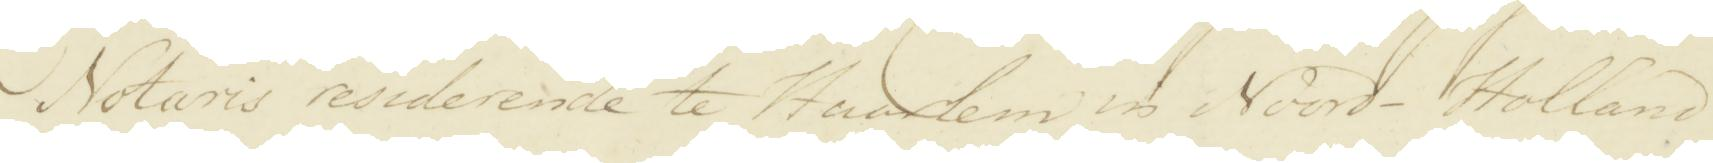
Notaris residerende te Haarlem in Noord- Holland
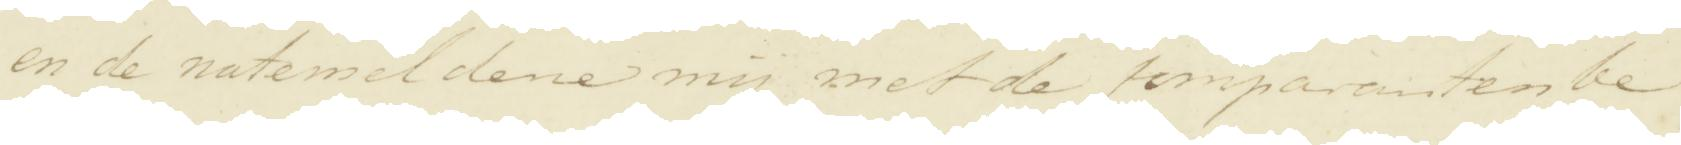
en de natemeldene mij met de Comparanten be
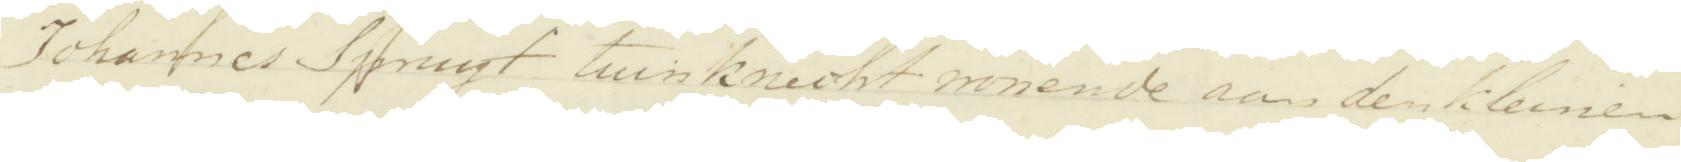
Iohannes Spruyt tuinknecht wonende aan den kleinen
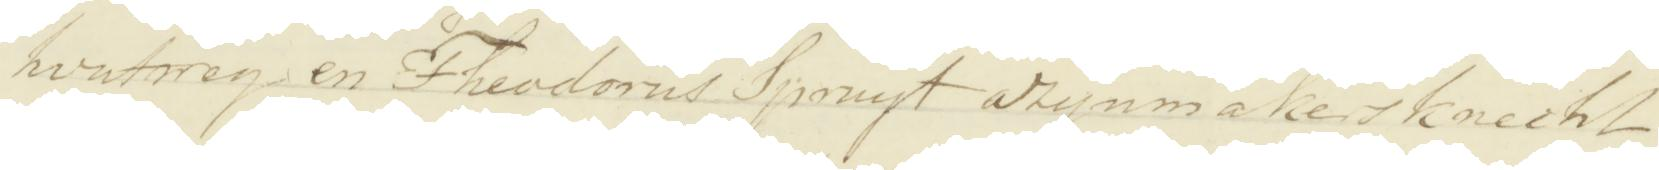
houtweg en Theodorus Spruyt azynmakersknecht
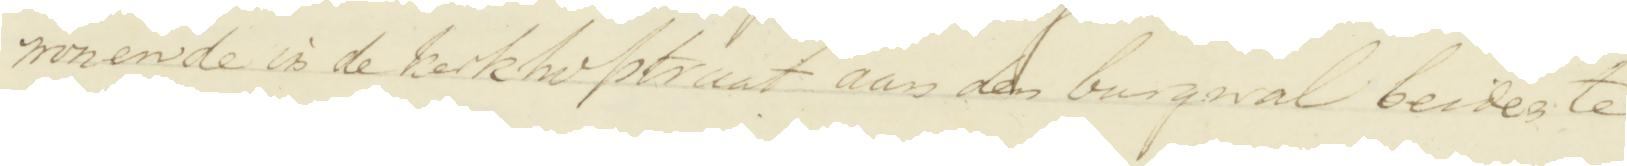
wonende in de kerkhofstraat aan den burgwal beiden te
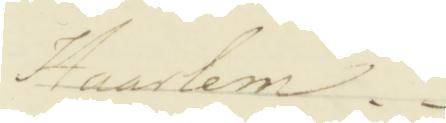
Haarlem. —
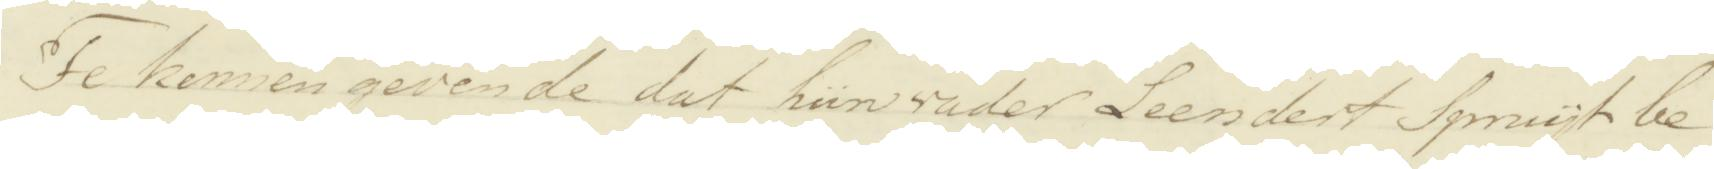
Te kennen gevende dat hun vader Leendert spruijt be
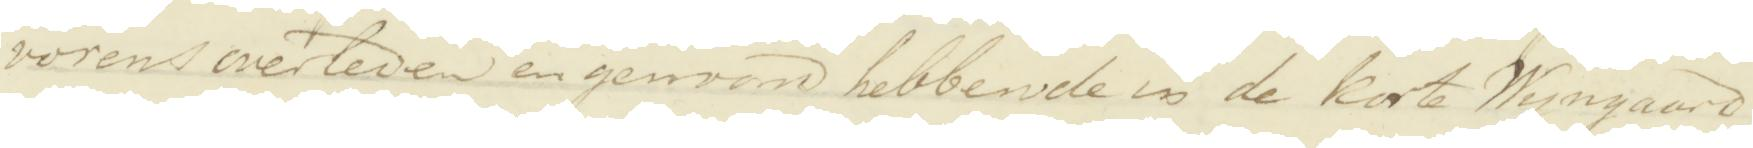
vorens overleden en gewoond hebbende in de korte Wyngaard
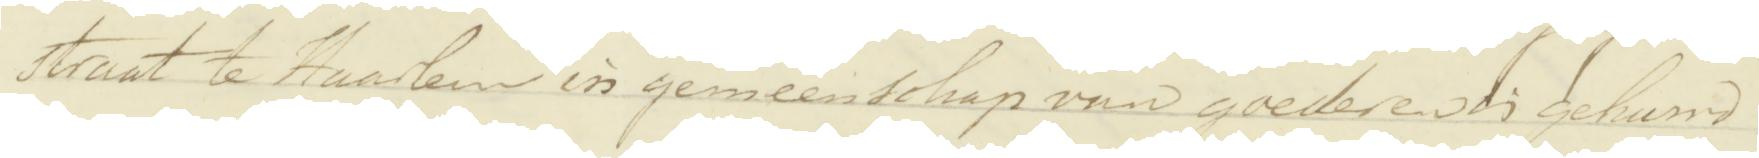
straat te Haarlem in gemeenschap van goederen is gehuwd
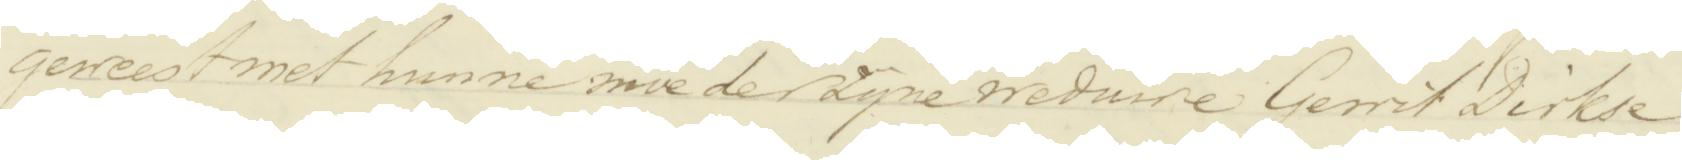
geweest met hunne moeder zijne weduwe Gerrit Dirkse
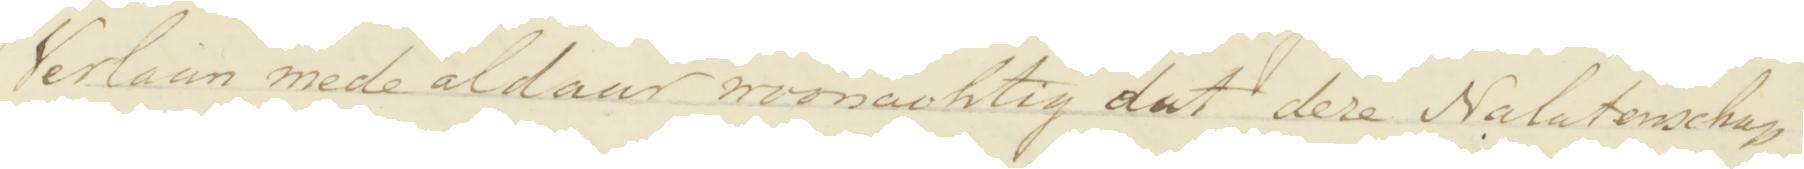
Verlaan mede aldaar woonachtig dat deze Nalatenschap
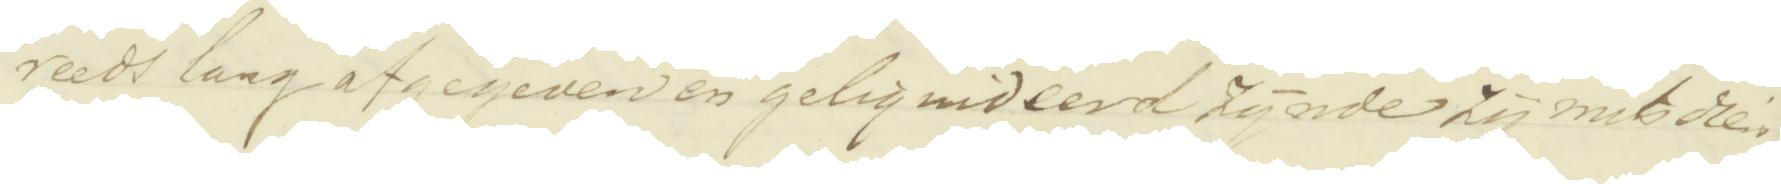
reeds lang afgegeven en geliquideerd zijnde zij mits dien
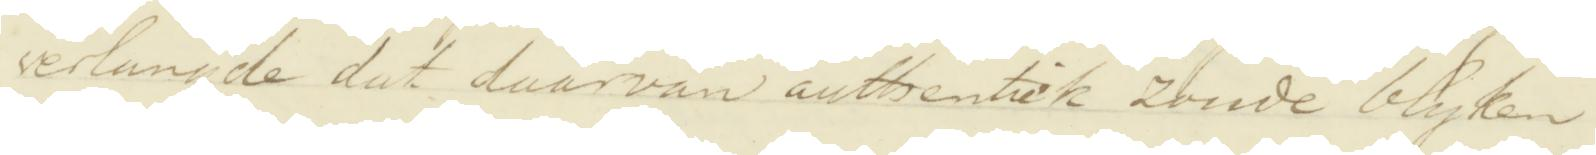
verlangde dat daarvan authentiek zoude blyken
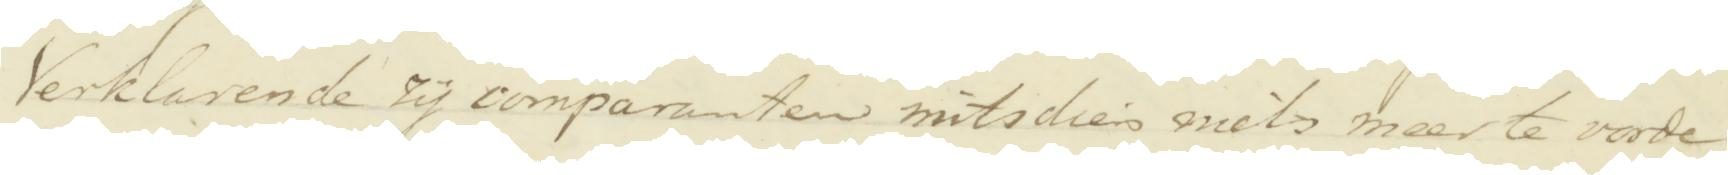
Verklarende zij comparanten mitsdien niets meer te vorde
